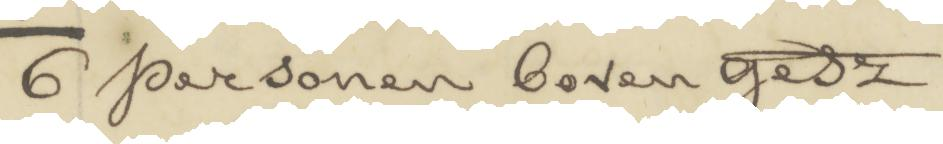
6 personen boven gesz
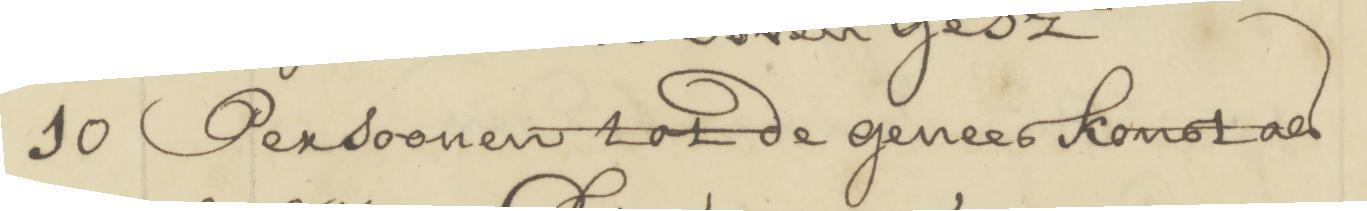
10 Persoonen tot de geneeskonst als
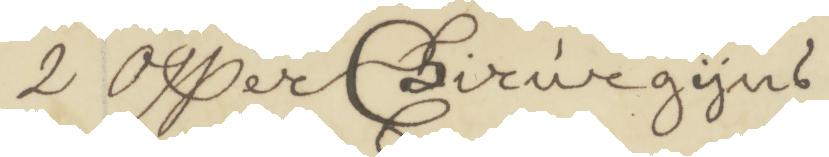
2 opper Chirurgijns
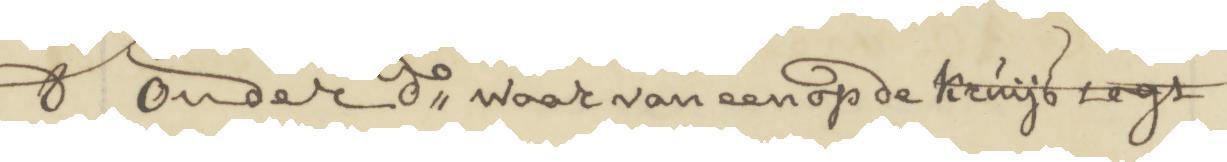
8 onder d„o waar van een op de kruijs togt
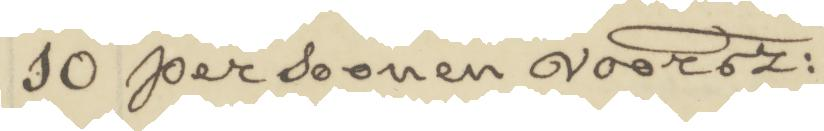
10 persoonen voorsz:
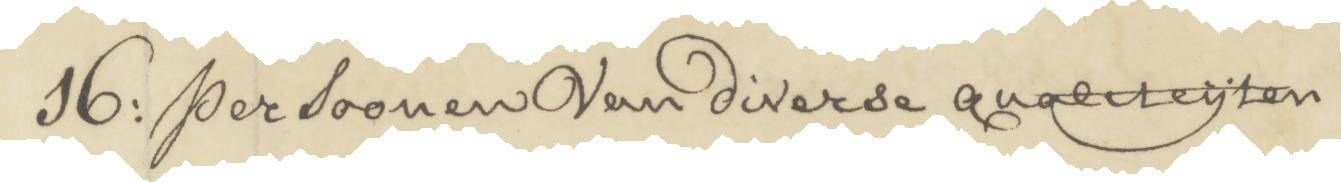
16: Persoonen van diverse qualiteijten
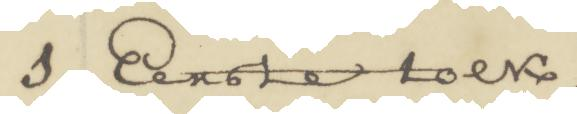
1 Eerste tolk
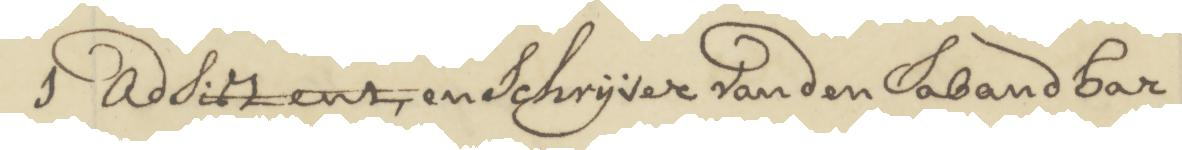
1 adsistent, en schrijver van den Sabandhar
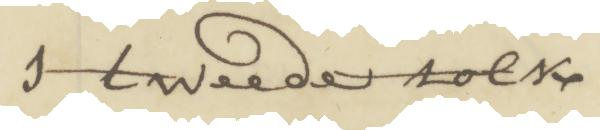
1 tweede tolk
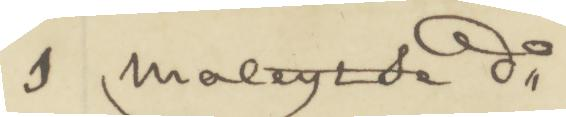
1 maleytse d„o
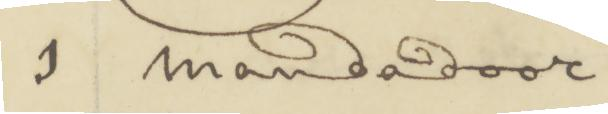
1 mandadoor
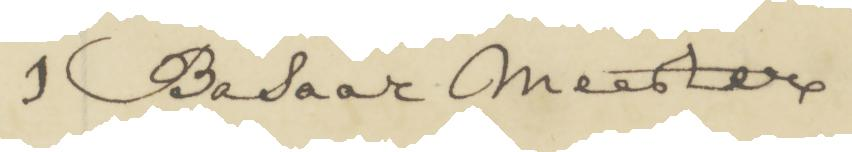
1 Basaar Meester
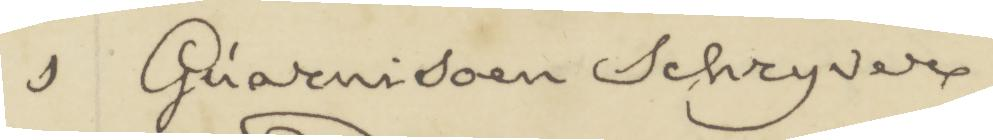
1 Guarnisoen schryver
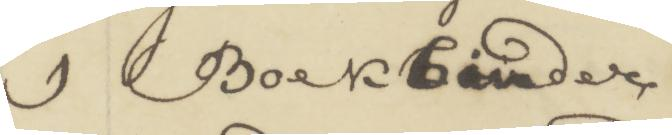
1 Boekbinder
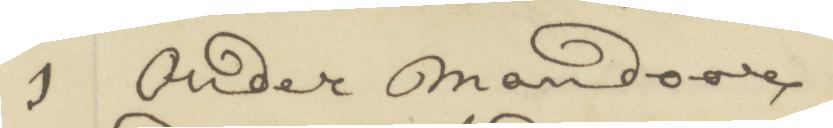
1 Onder mandoor
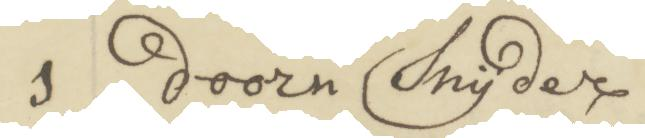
1 doorn snijder
